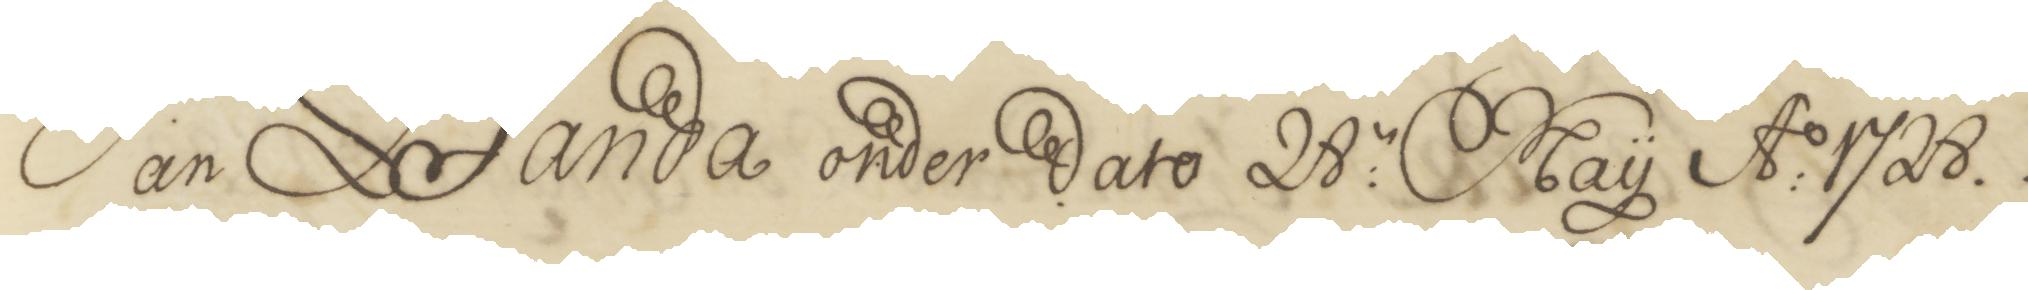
Van Banda onder dato 28:' Maij A:o 1728.
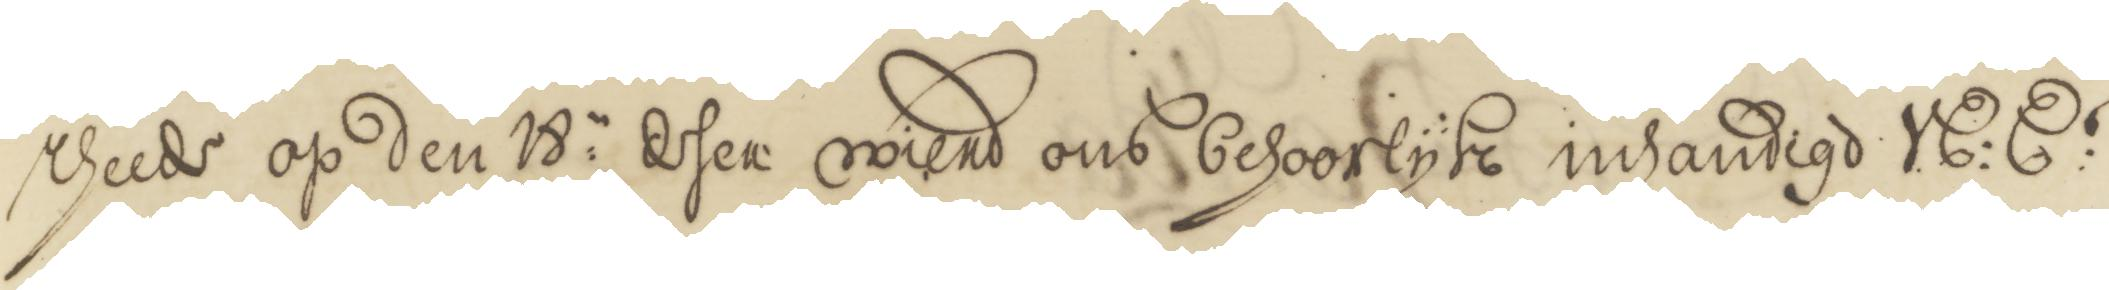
rheede op den 18:n deser wierd ons behoorlijk inhandigd VE: E:s
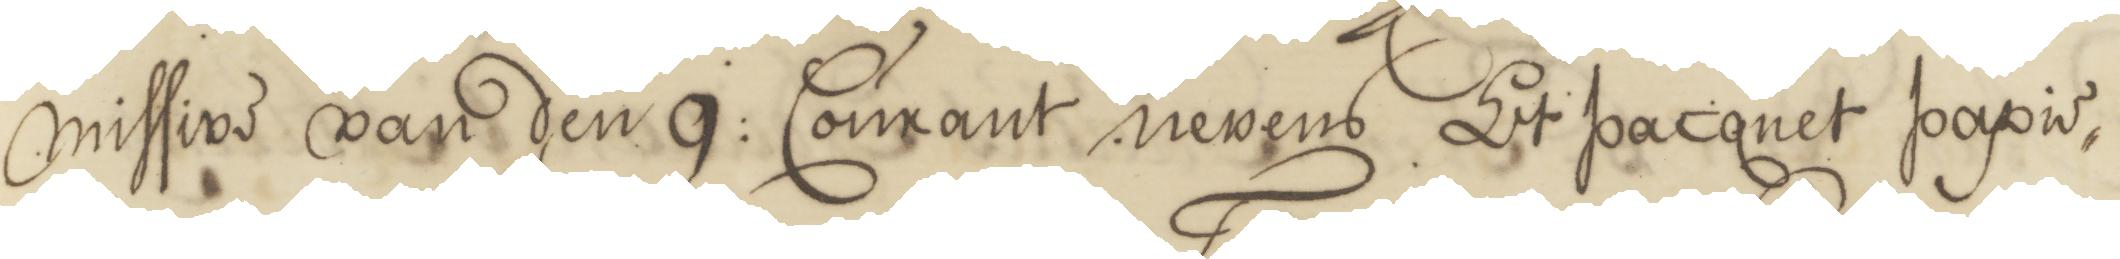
missive van den 9: Courant nevens het pacquet papie,
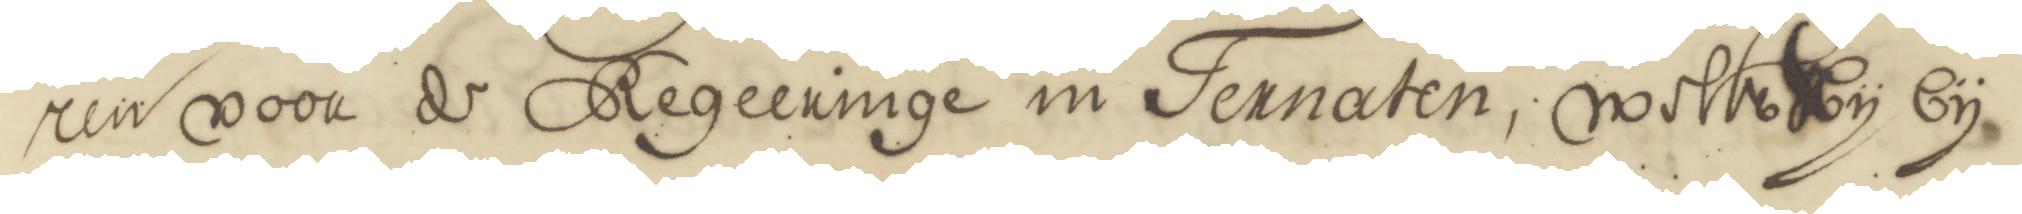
ren voor de Regeeringe in Ternaten; welk bij bij
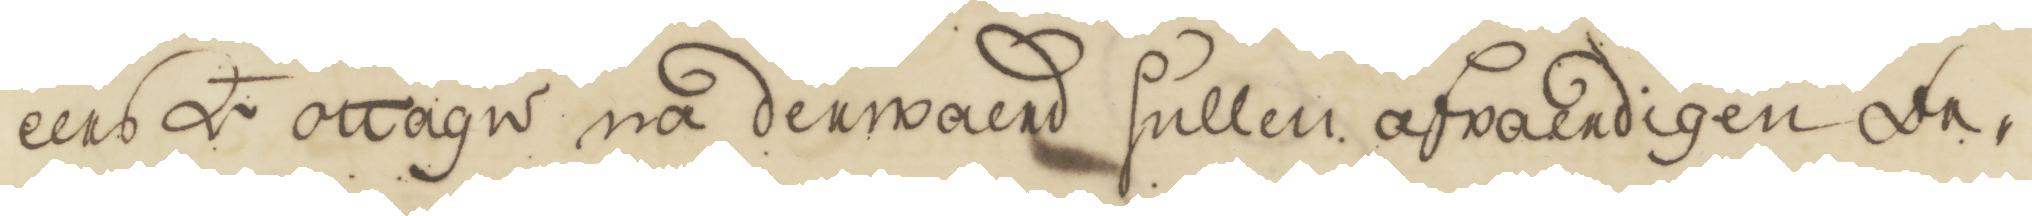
eerste occagie na derwaerd sullen afvaerdigen ter„
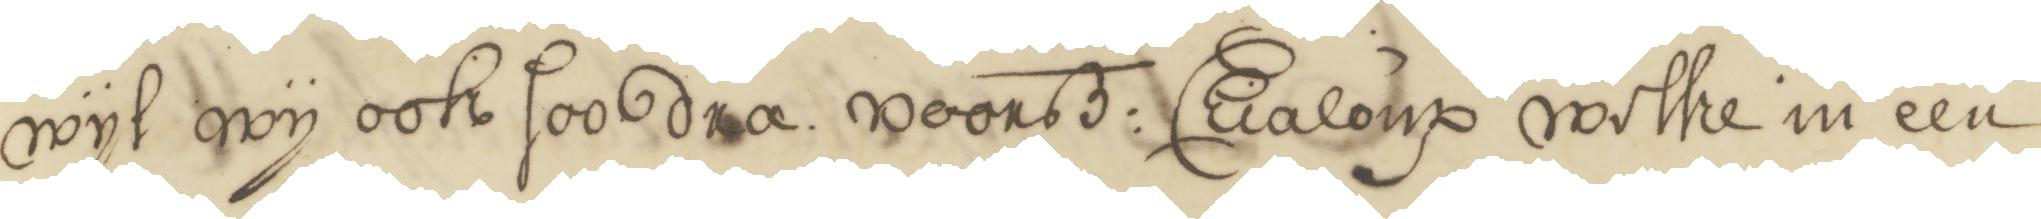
wijl wij ook Soodra voorsz: Chialoup welke in een
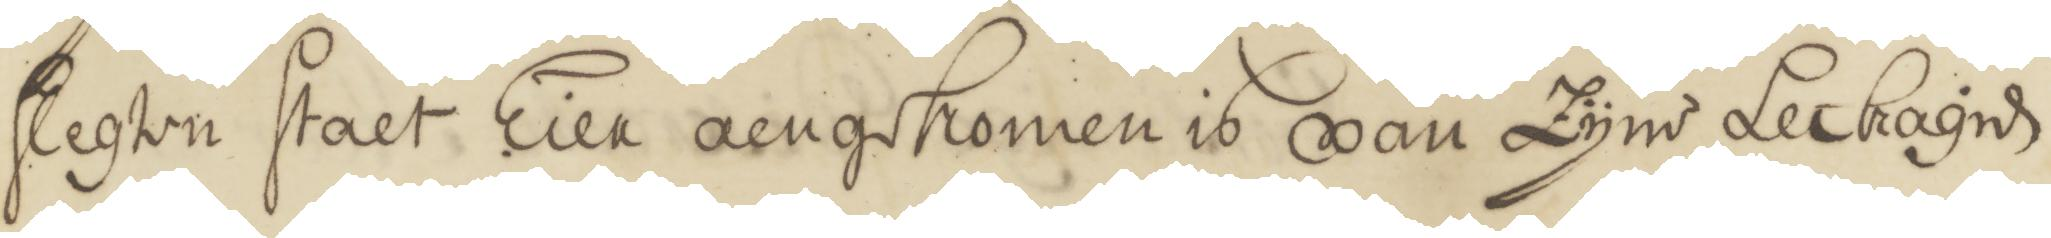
Slegten Staet hier aengekomen is van Zijne Leckagien
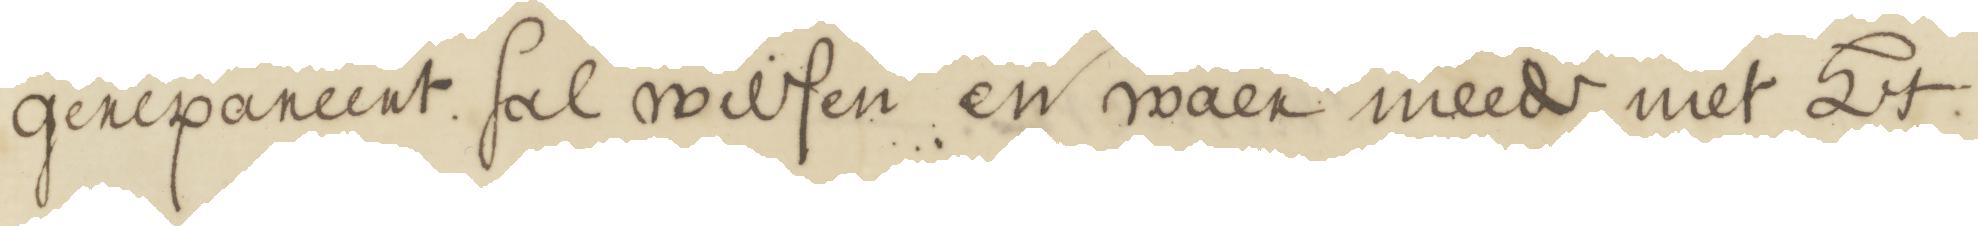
gerepareert Sal weesen en waer meede met het
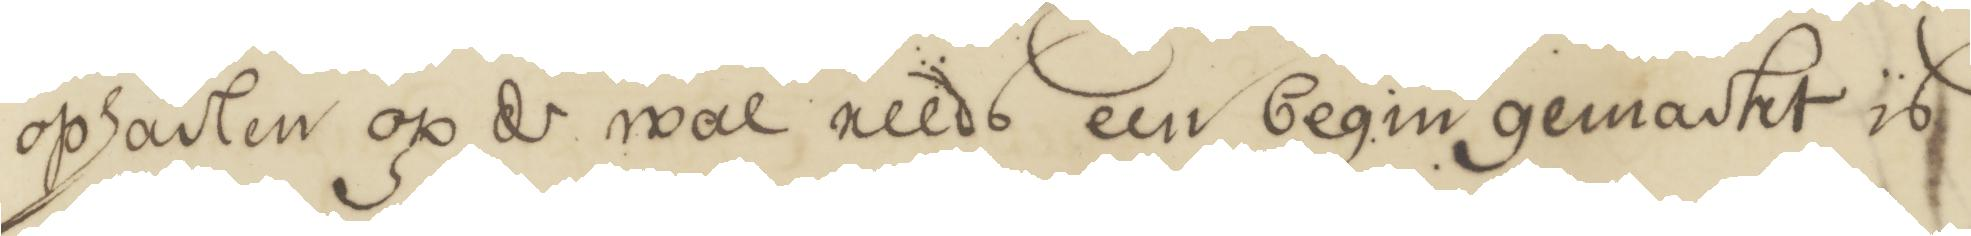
ophaelen op de wal reeds een begin gemaekt is
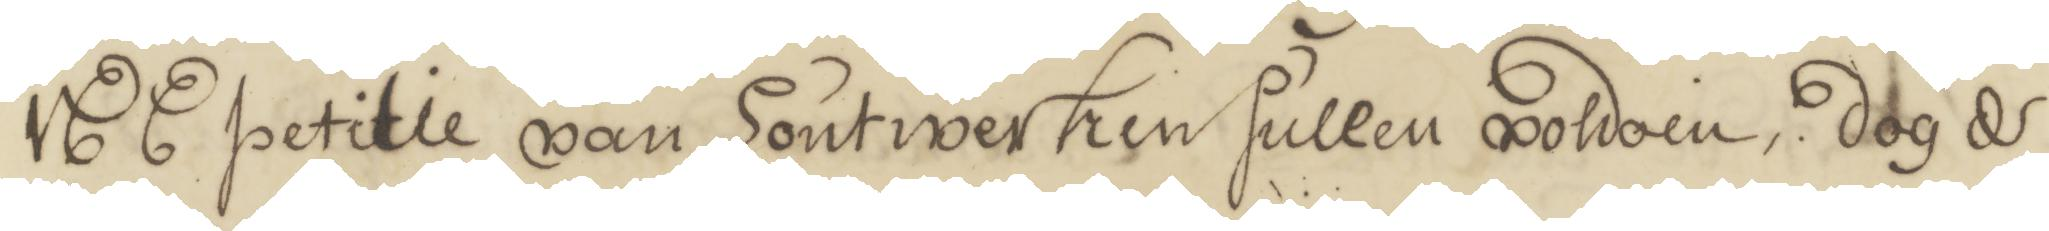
UE E petitie van houtwerken sullen voldoen, dog de
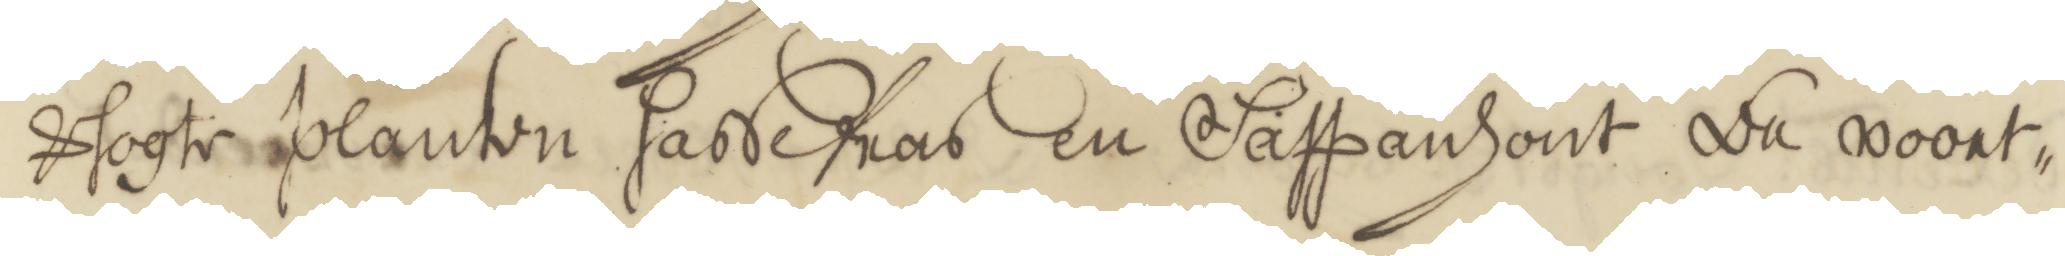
versogte planten Sassefras en Sappanhout ter voort„
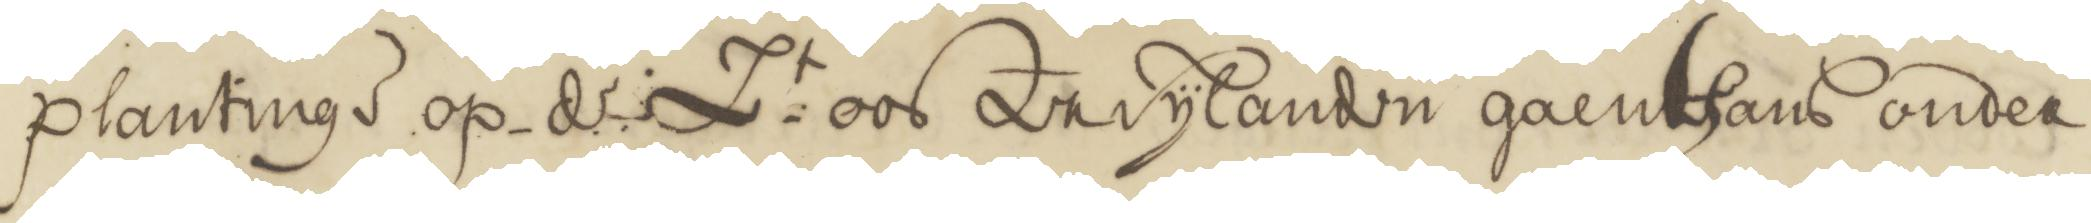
plantings op de Z=t ooster Eijlanden gaen thans onder
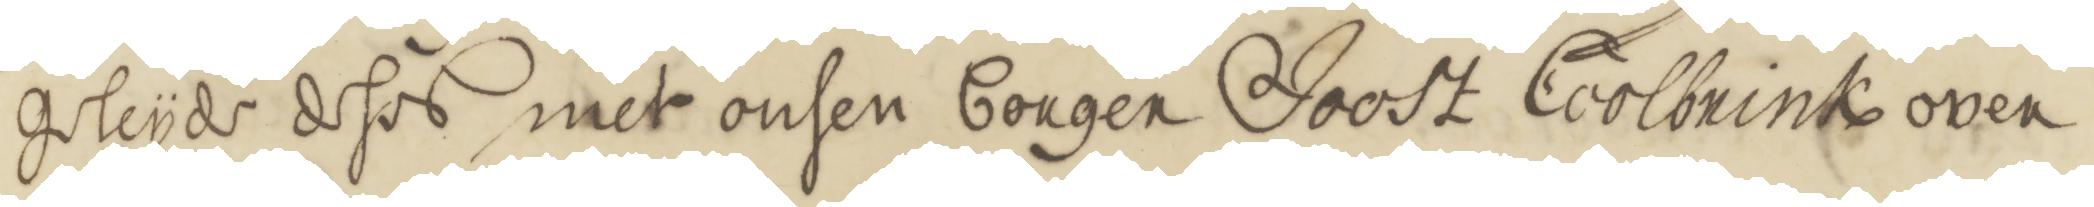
geleijde deses met onsen borger Joost Coolbrink over
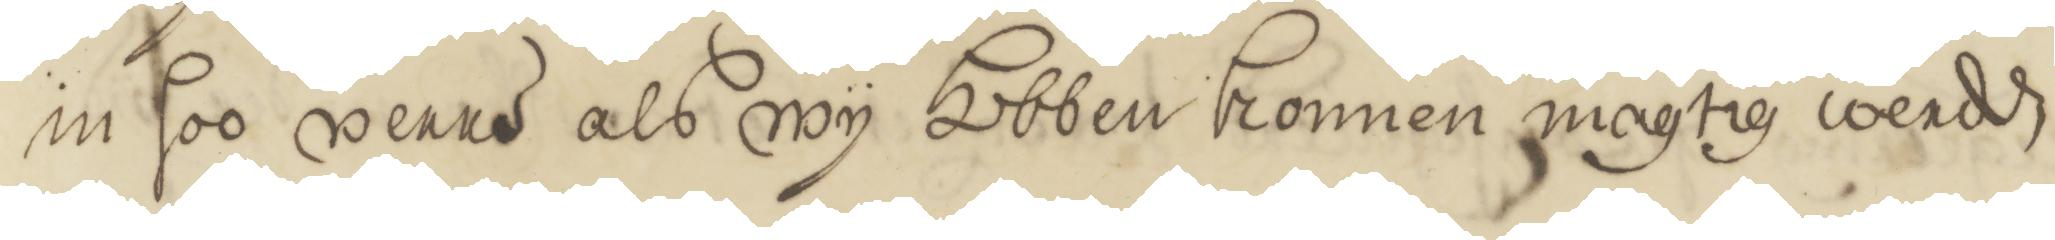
in Soo verre als wij hebben konnen magtig werden
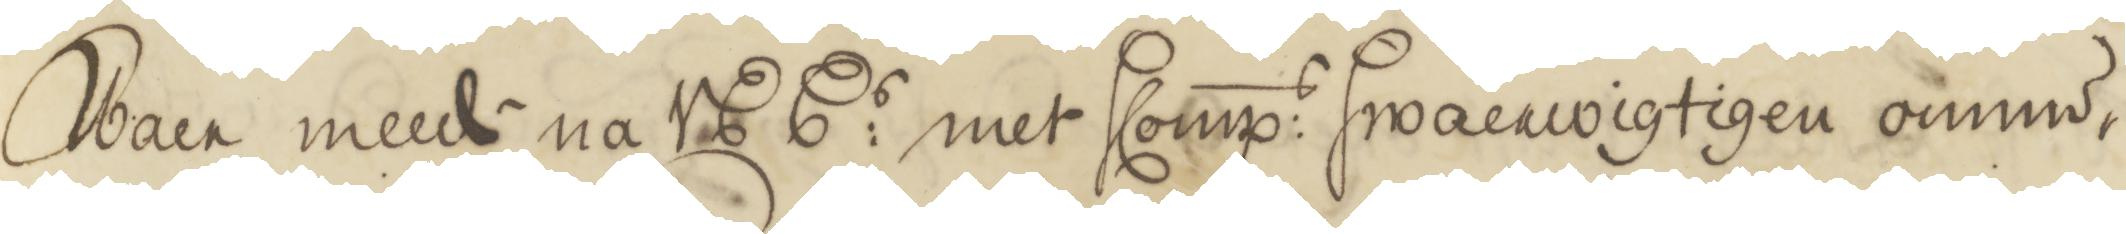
Waer meede na UE E:s met SComp:s Swaerwigtigen omme„
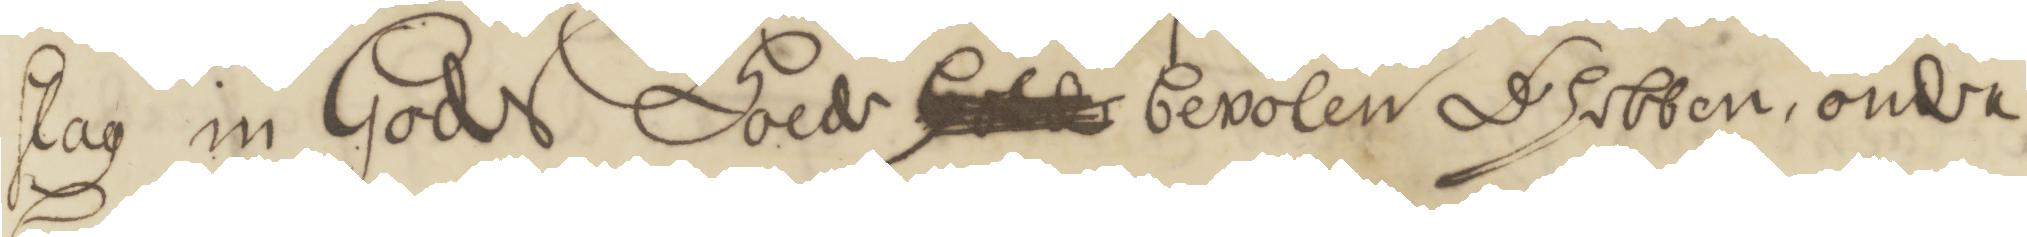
Slag in Godes Hoede Holder bevolen te hebben, onder
